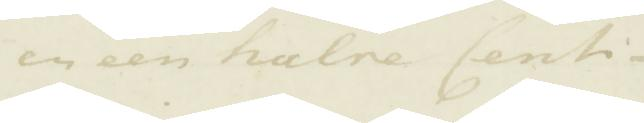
en een halve Cents-
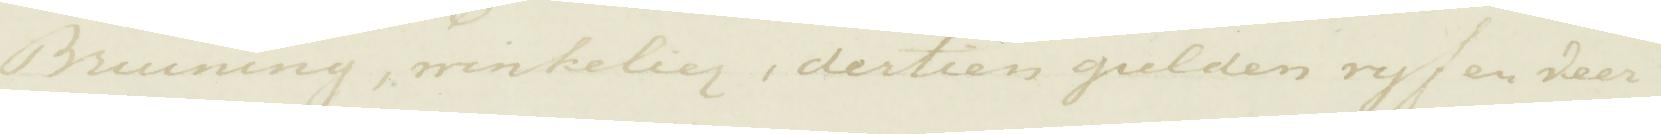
Bruining, winkelier, dertien gulden vyf en veer
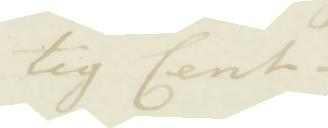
tig Cent.
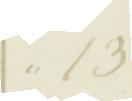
„ 13
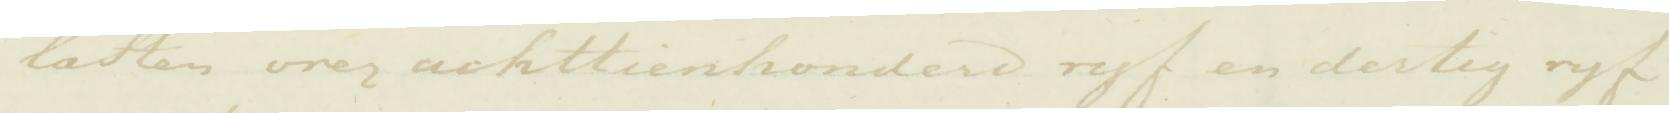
lasten over achttienhonderd vyf en dertig vyf
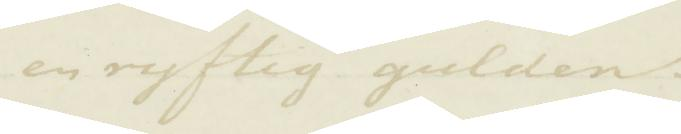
en vyftig gulden.
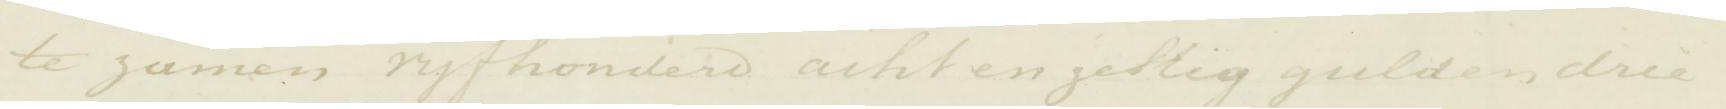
te zamen vyfhonderd acht en zestig gulden drie
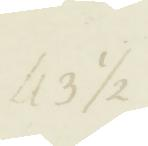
43½
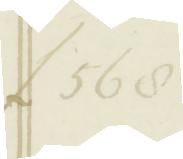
ƒ 568
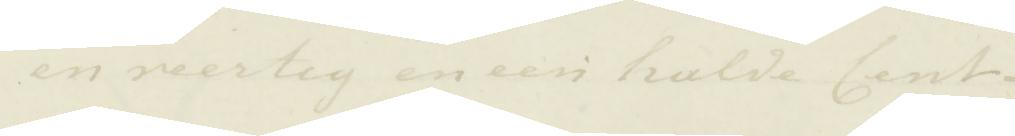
en veertig en een halve Cent
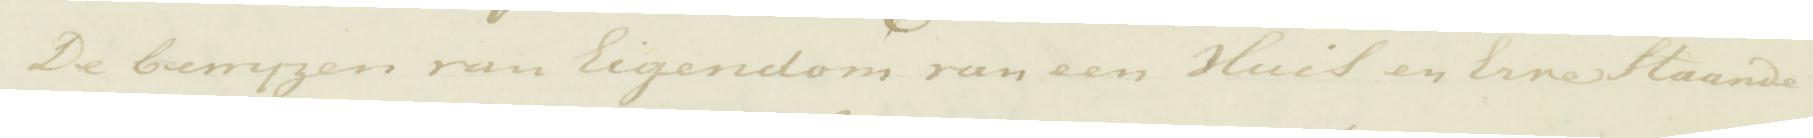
De bewyzen van Eigendom van een Huis en Erve staande
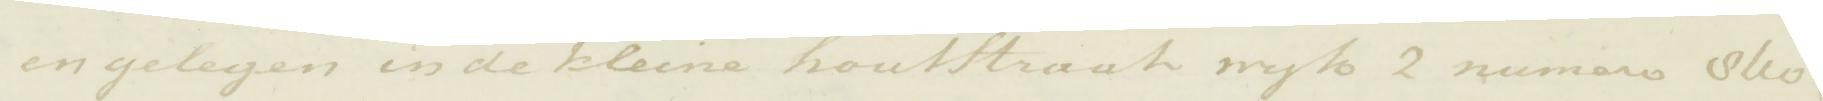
en gelegen in de kleine houtstraat wyk 2 numero 840
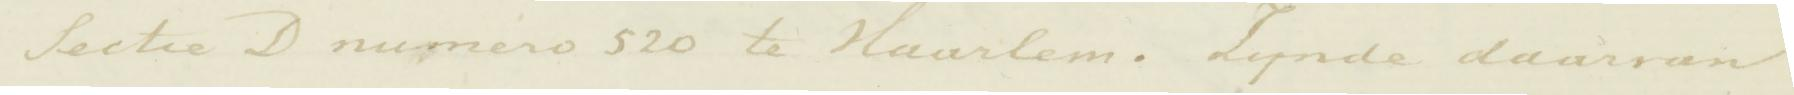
sectie D numero 520 te Haarlem, Zynde daarvan
